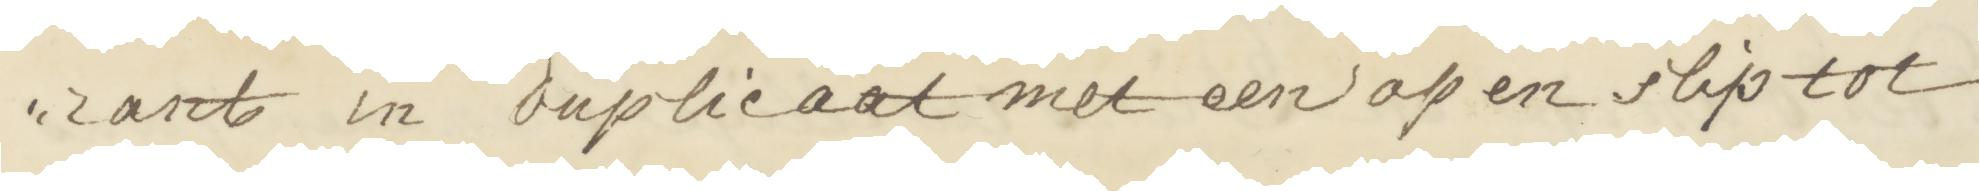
„rant in duplicaat met een open slip tot
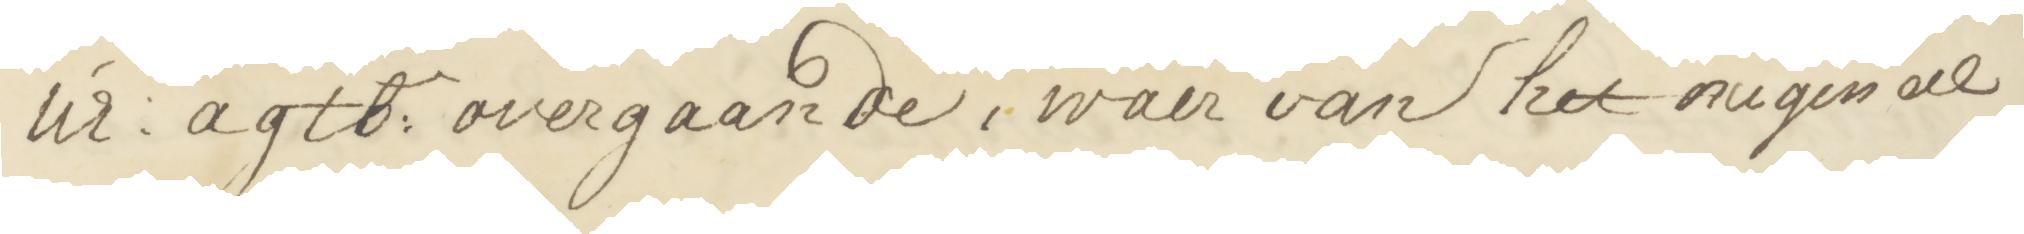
UE: agtb:e overgaande, waer van het origineel
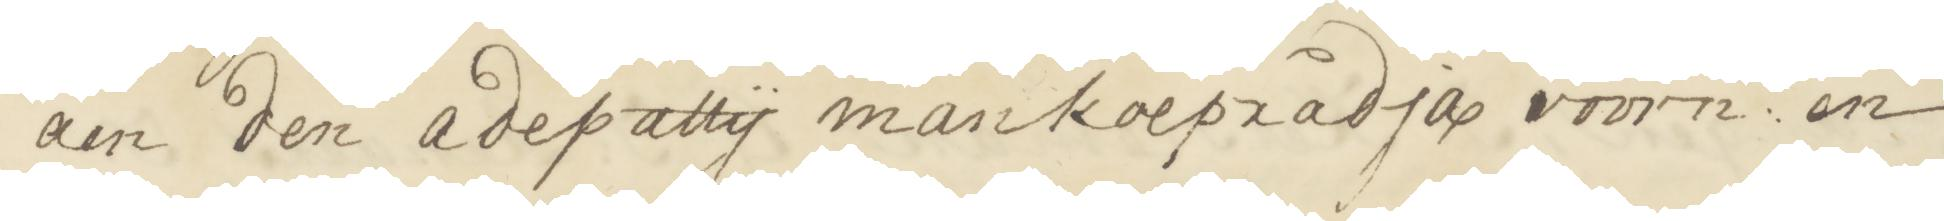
aen den adepattij mankoepradja voorn:t en
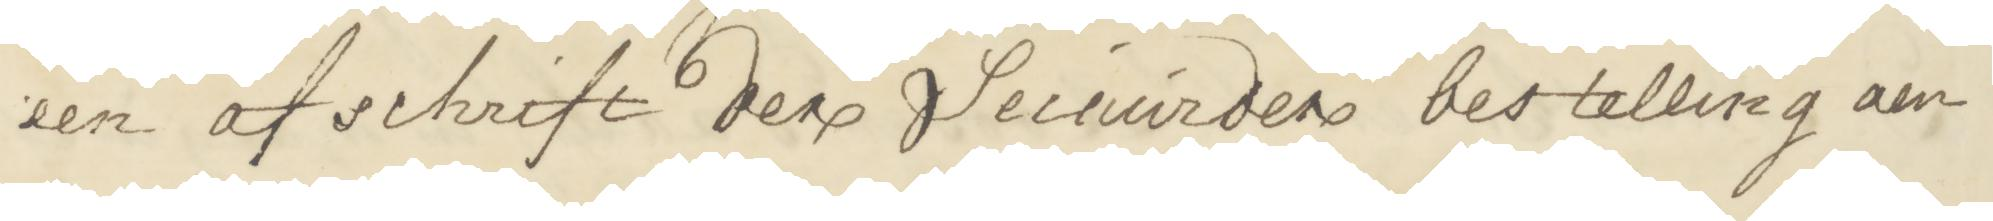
een afschrift der secuurder bestelling aen
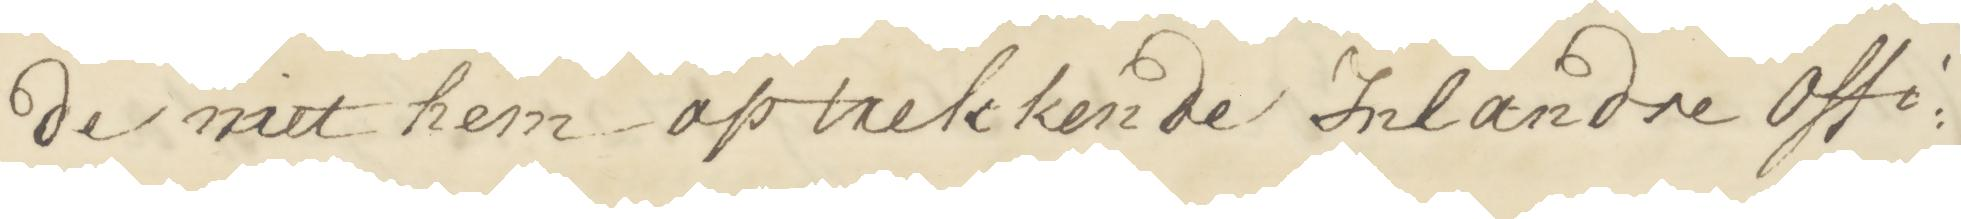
de met hem optrekkende Inlandse offi„
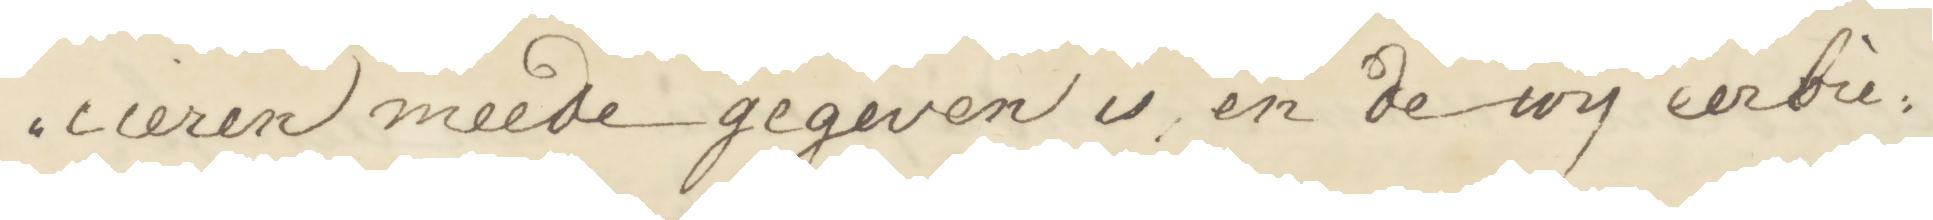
„cieren meede gegeven is, en de wij eerbie„
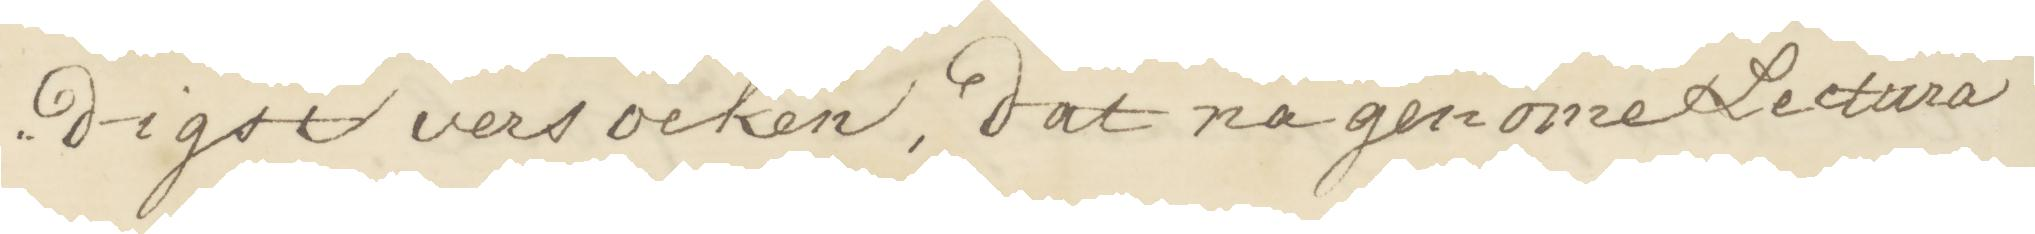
„digst versoeken, dat na genome Lectura
